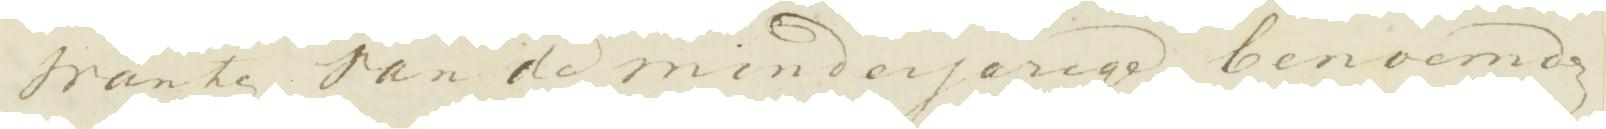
wanten van de minderjarige benoemden
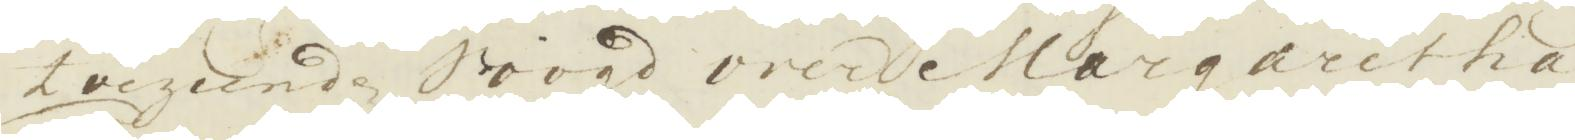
toezienden Voogd over Margaretha
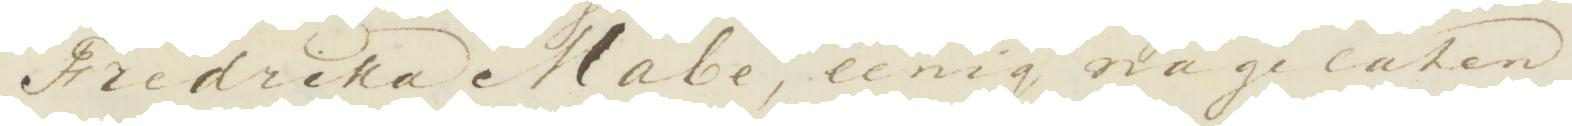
Fredrika Mabé, eenig na gelaten
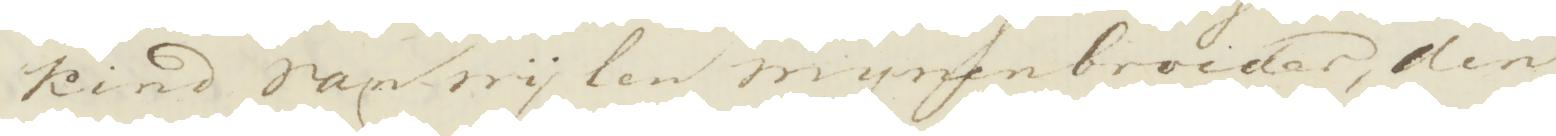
kind van wijlen mijnen broeder, den
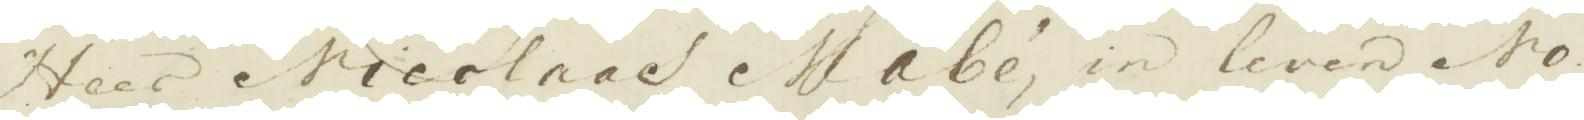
Heer Nicolaas Mabé, in leven No.
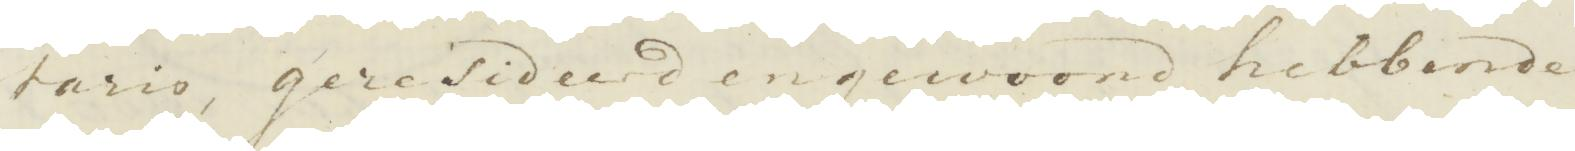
taris, geresideerd en gewoond hebbende
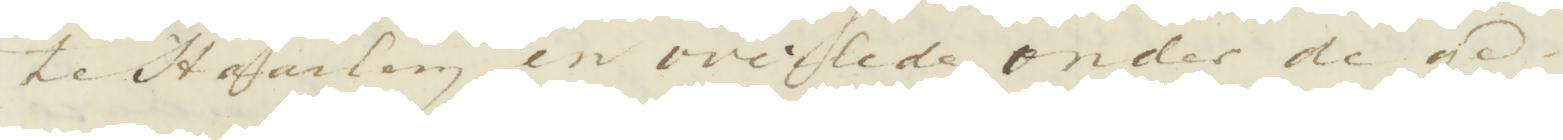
te Haarlem en overleden onder de ge=
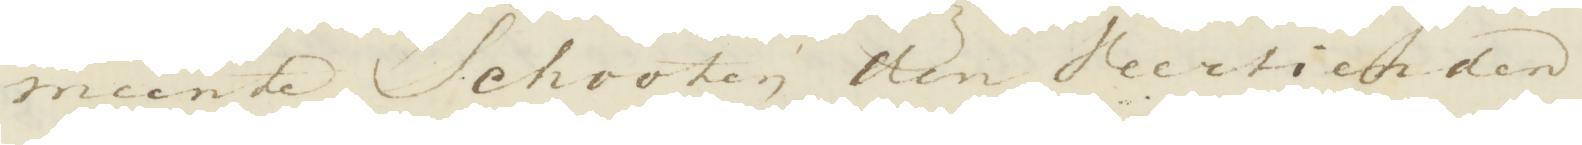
meente Schooten den Veertienden
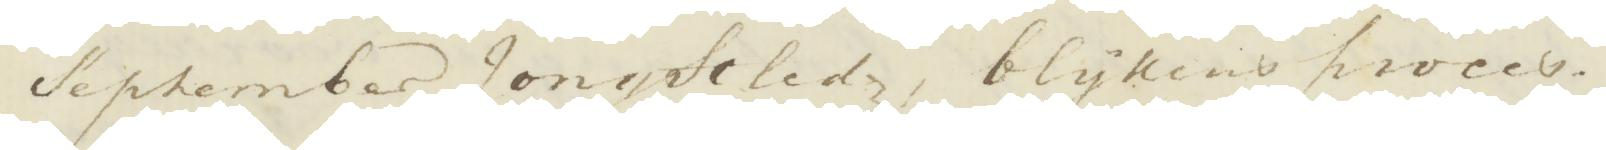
September Jongstleden, blijkens proces.
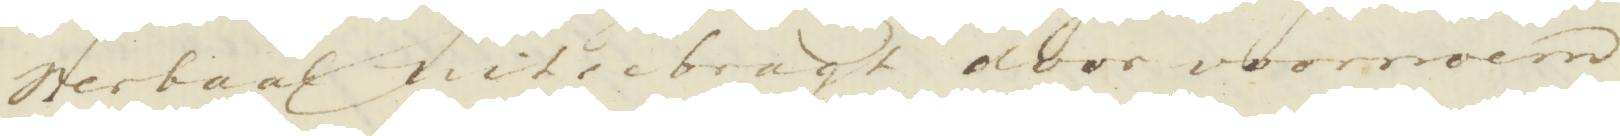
verbaal uitgebragt door voornoem
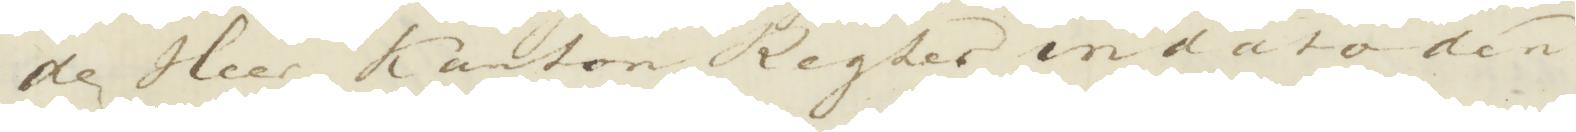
den Heer Kanton Regter in dato den
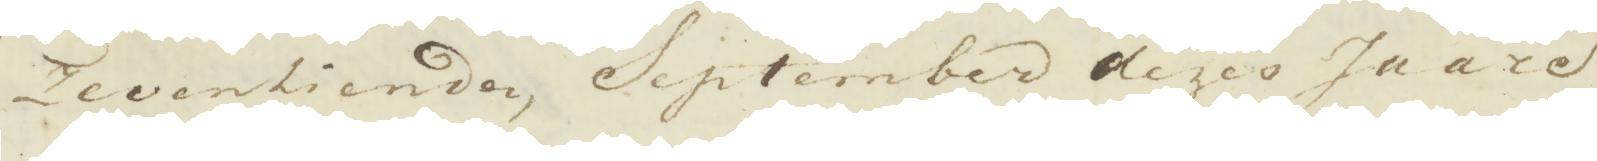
Zeventiende, September dezes Jaars
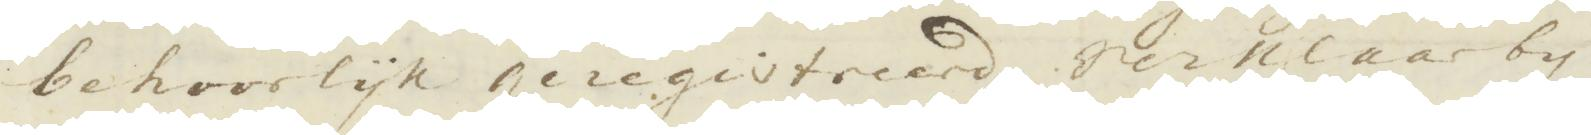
behoorlijk geregistreerd, verklaar by
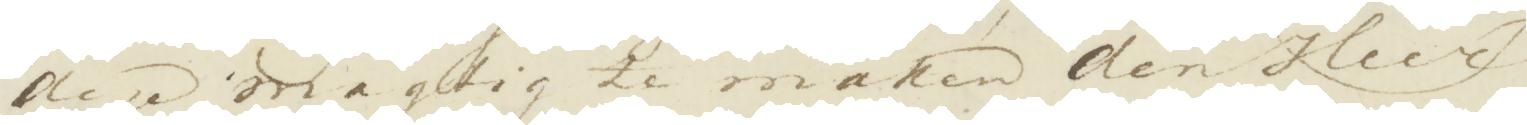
deze magtig te maken den Heer
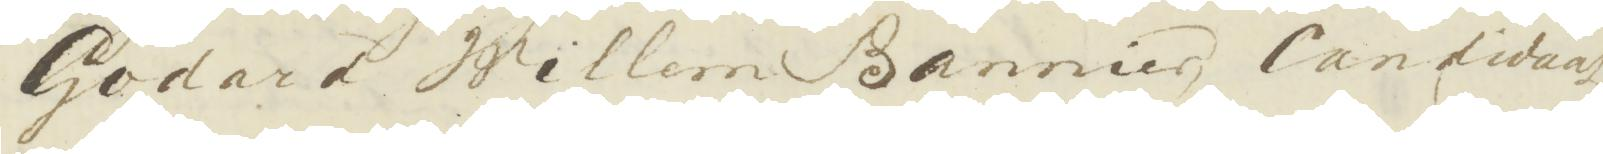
Godard Willem Bannier Candidaat
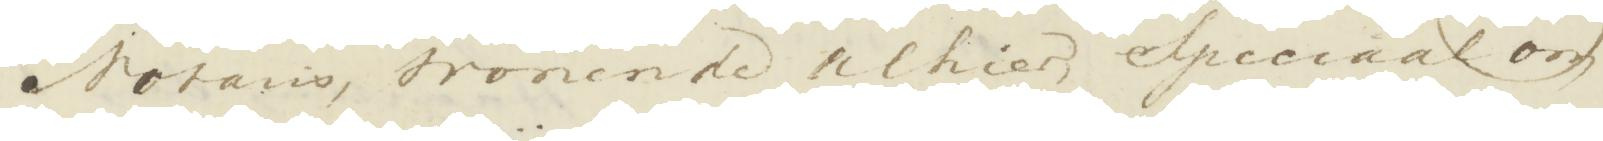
Notaris, wonende alhier Speciaal om
